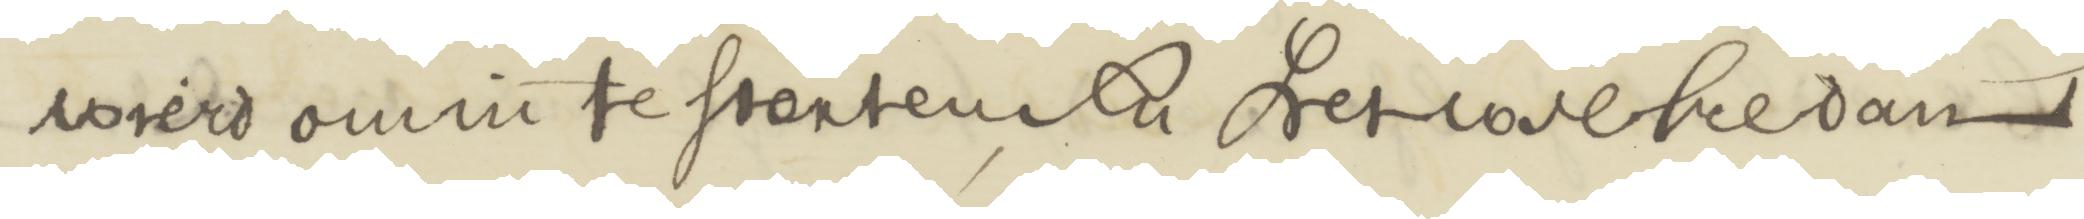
wierd om in te storten, En het welke dan
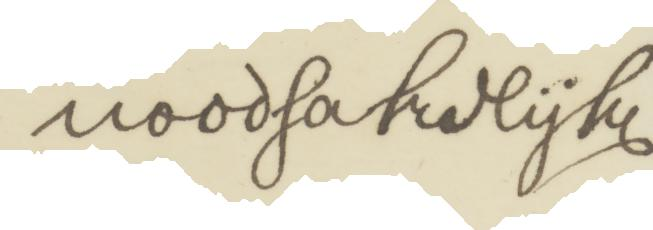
noodsakelijk
